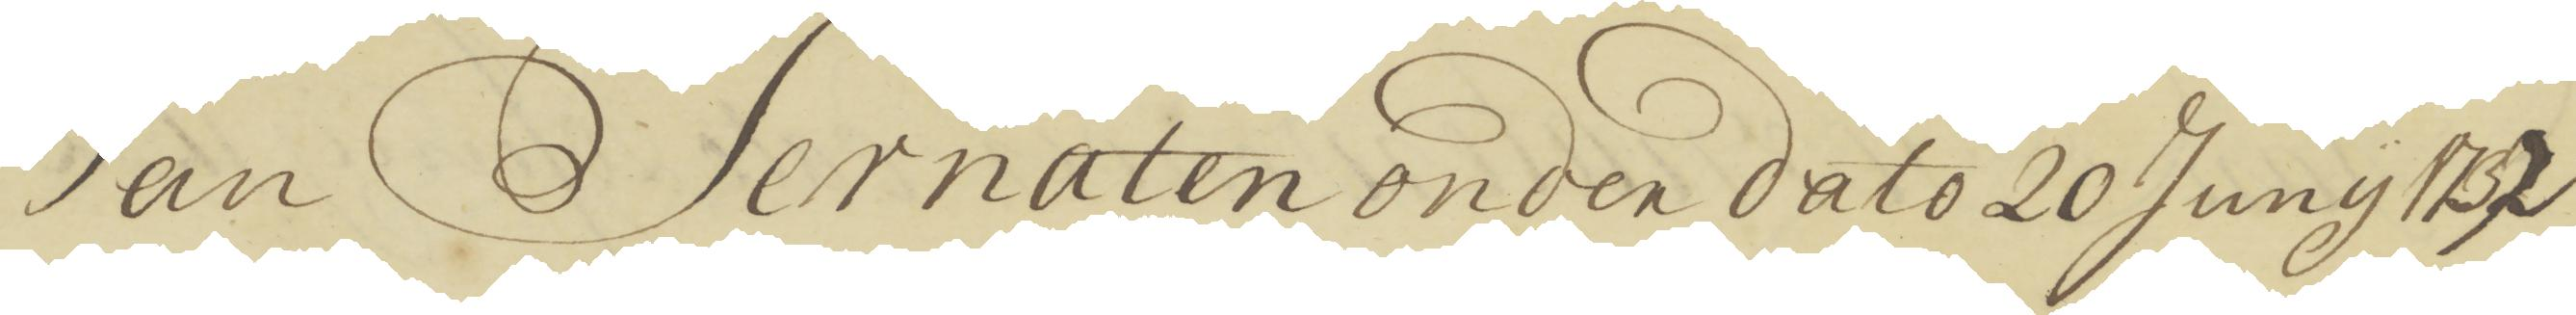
Van Ternaten onder dato 20 Junij 1732
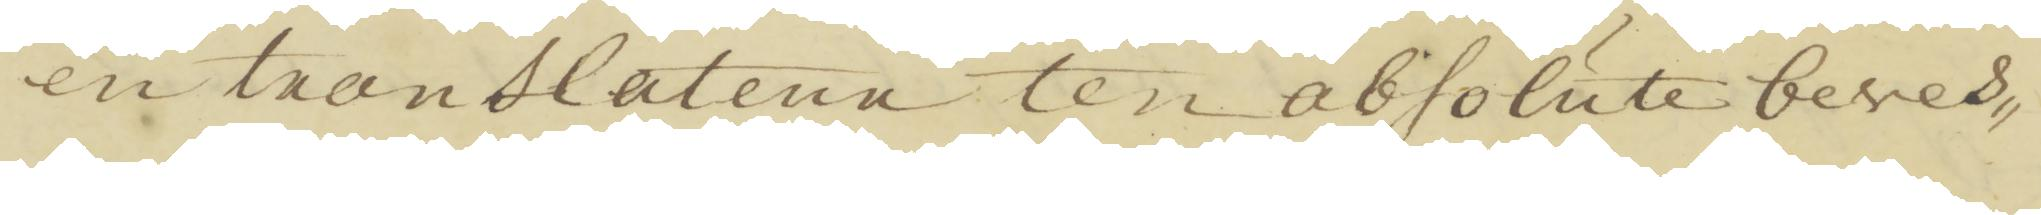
en translateur ten absolute beves„
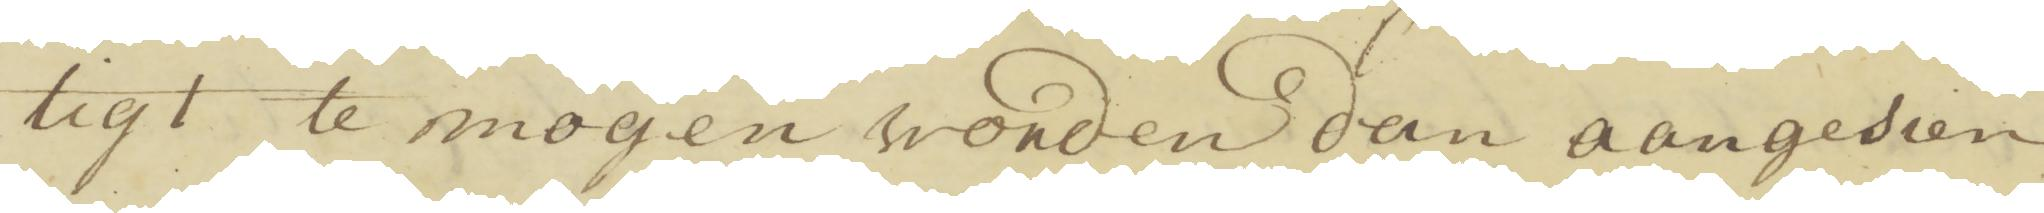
tigt te mogen worden dan aangesien
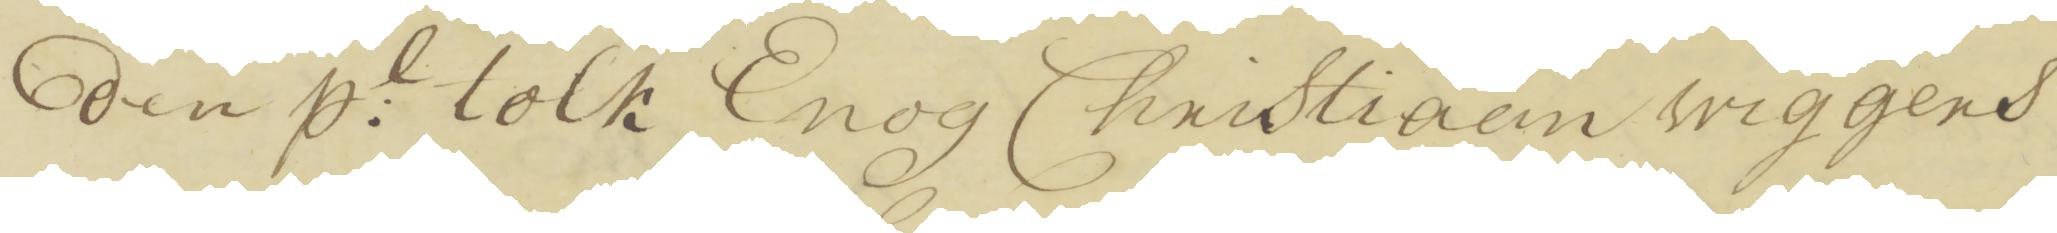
den p:l tolk Enog Christiaan wiggers
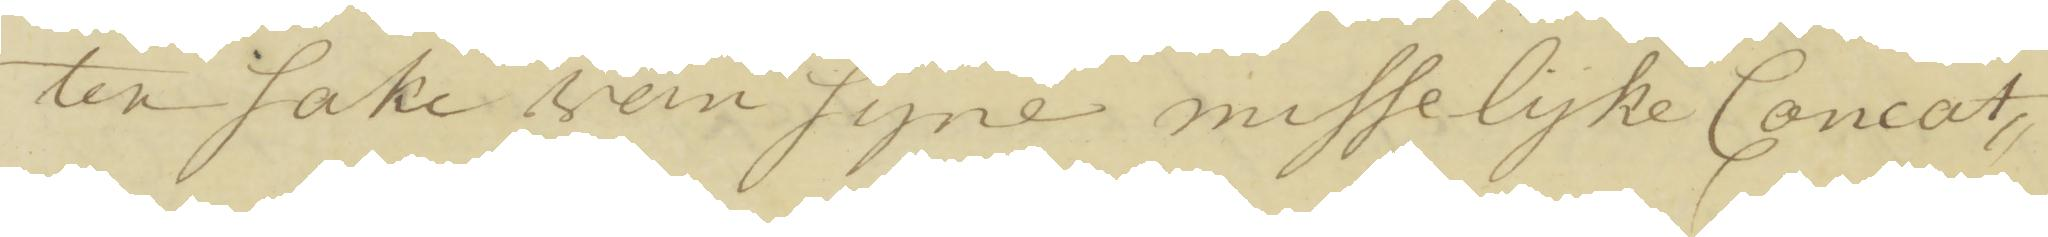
ter sake van syne misselijke Concat„
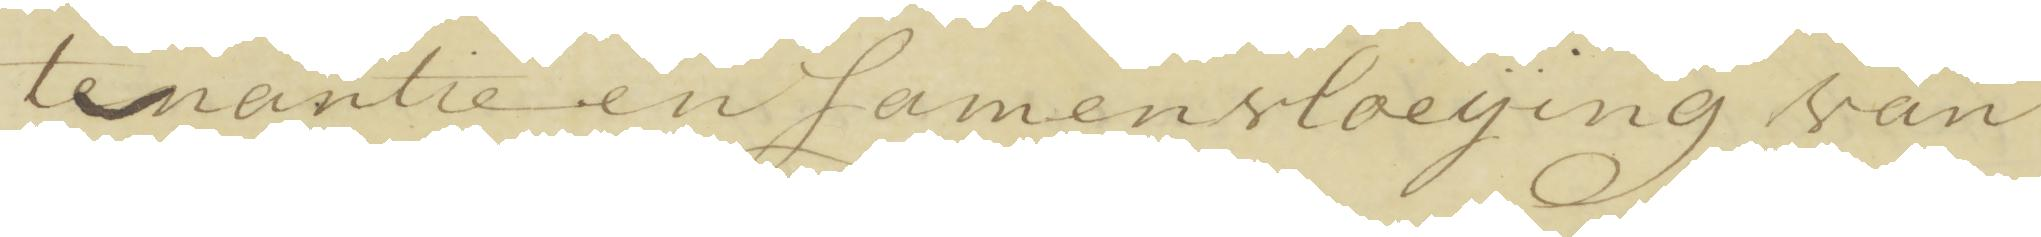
tenantie en samenvloeijing van
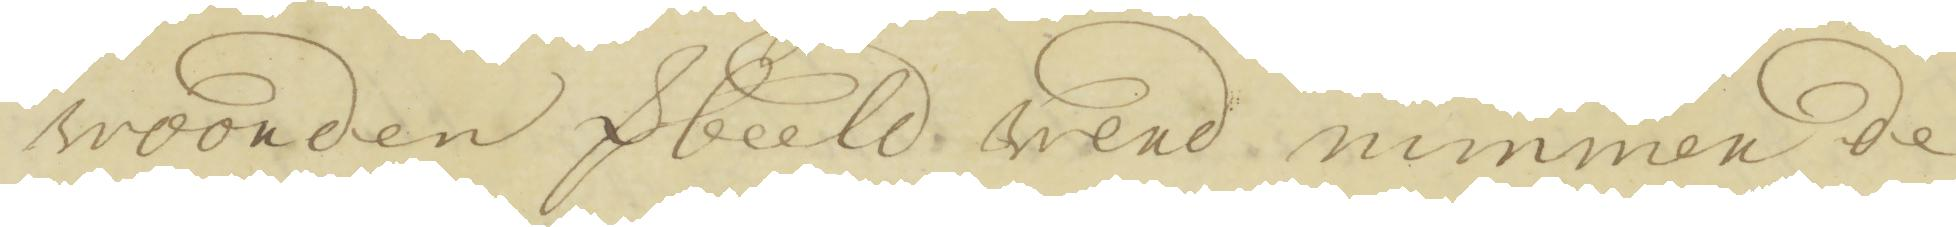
woorden verbeeld werd nimmer de
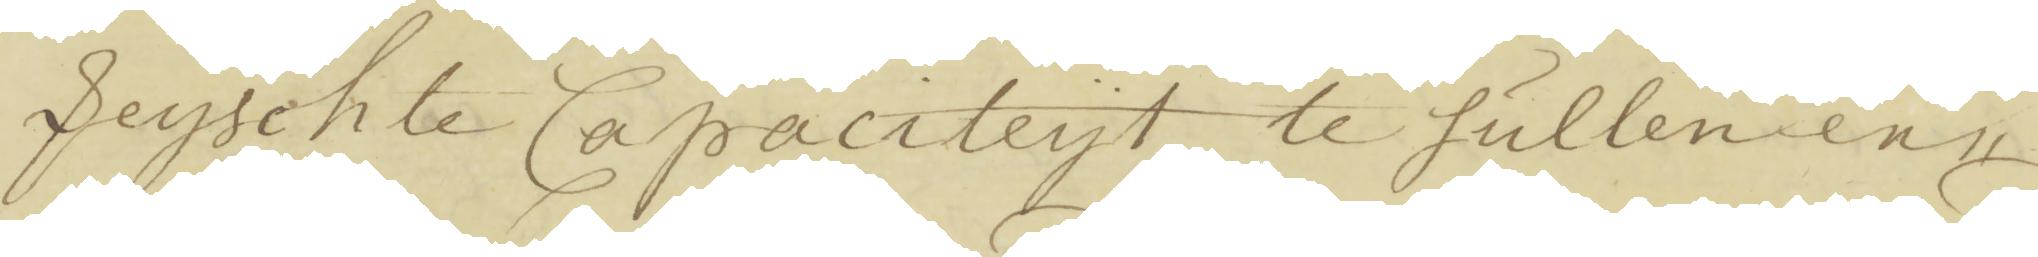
vereyschte Capaciteijt te sullen er„
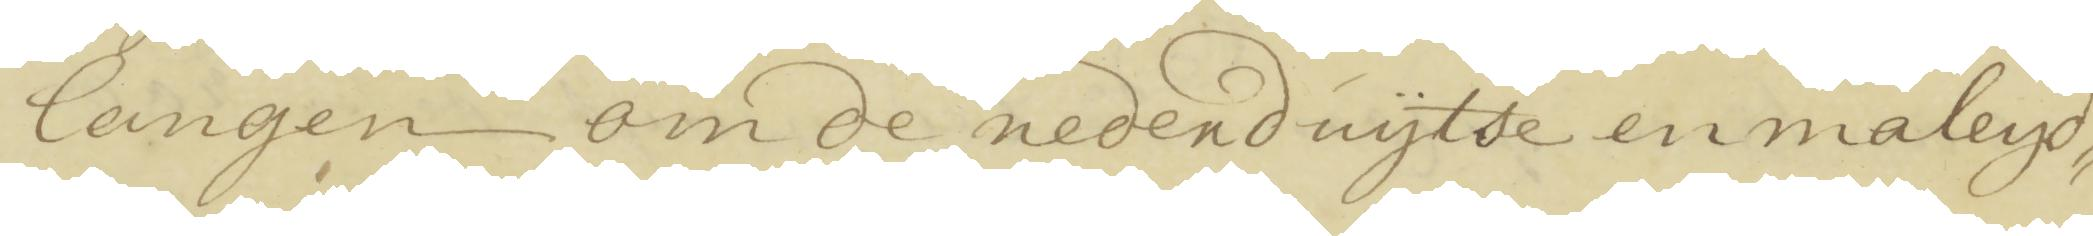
langen om de nederduijtse en maleyd„
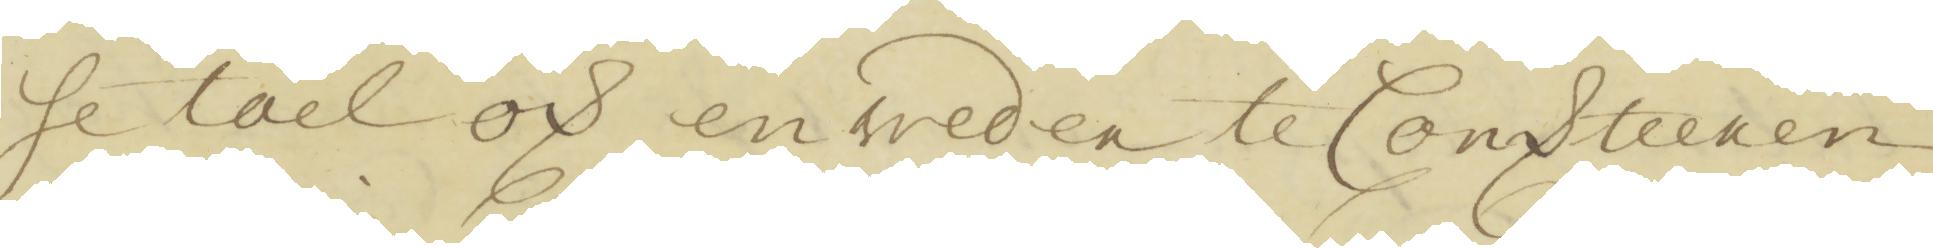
se tael over en weder te Converteeren,
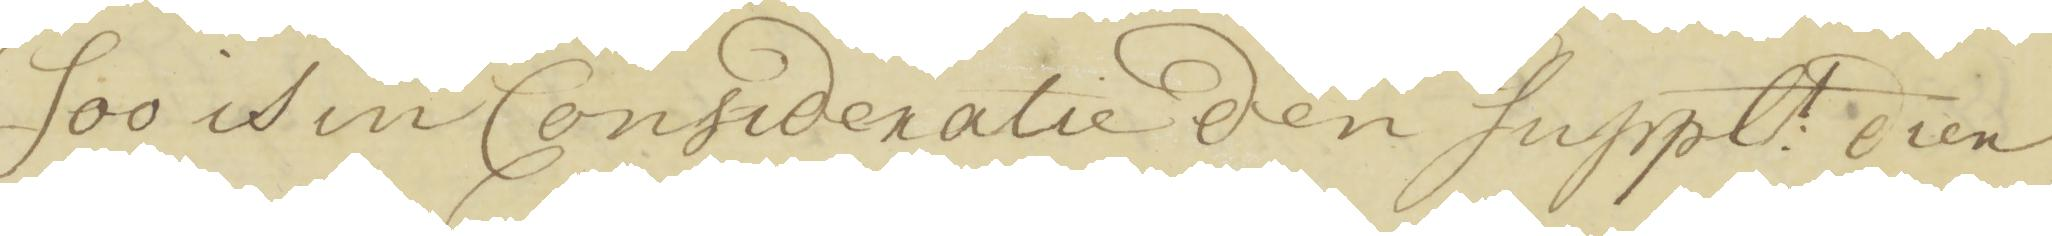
Soo is in Consideratie den suppl:t dier
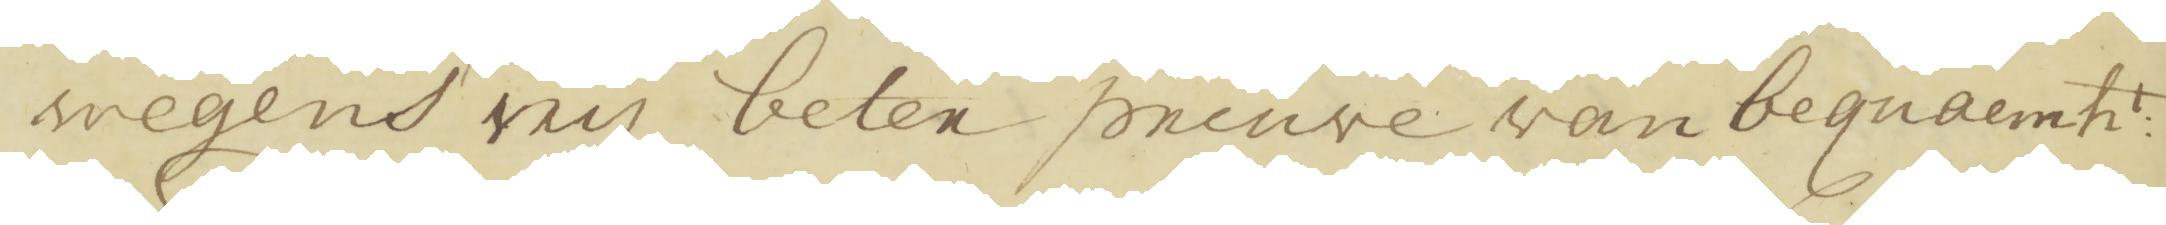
wegens vrij beter preuve van bequaemh:t
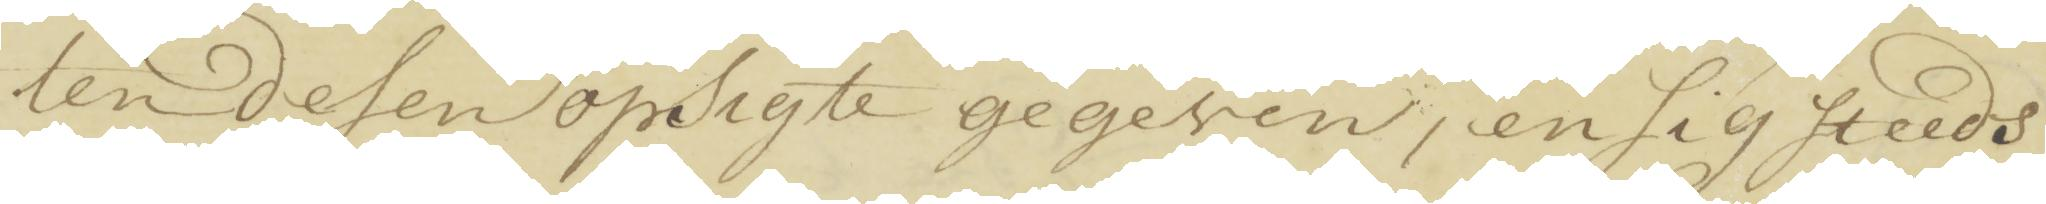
ten desen op sigte gegeven, en sig steeds
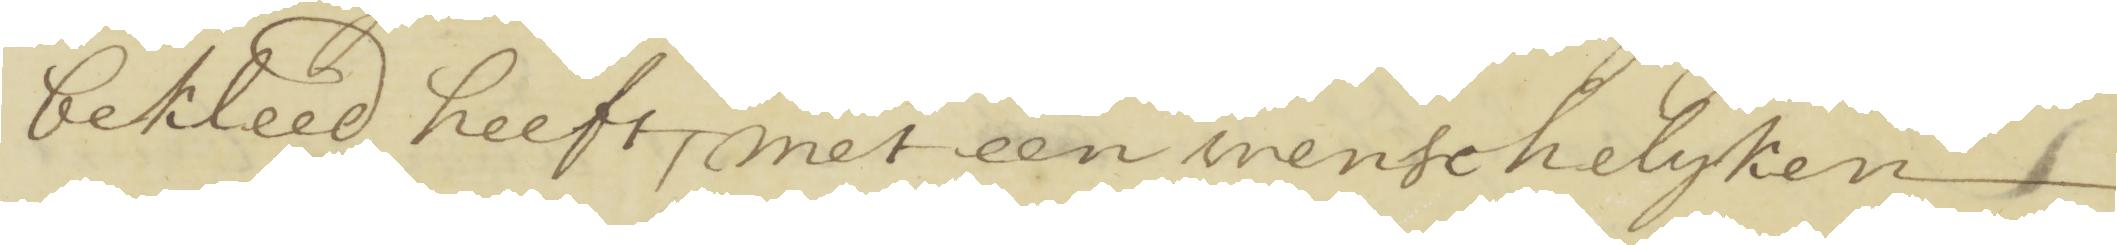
bekleed heeft, met een wenschelyken
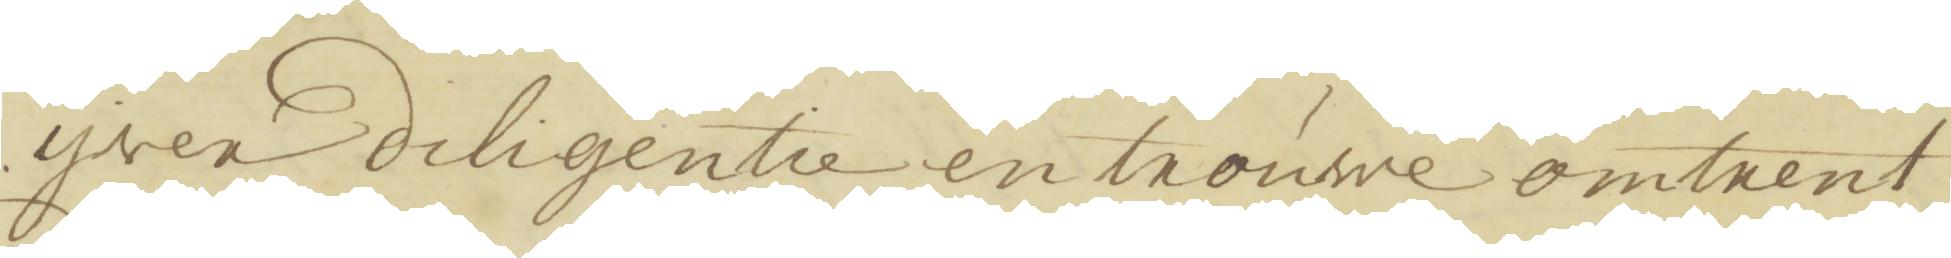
ijver diligentie en trouwe omtrent
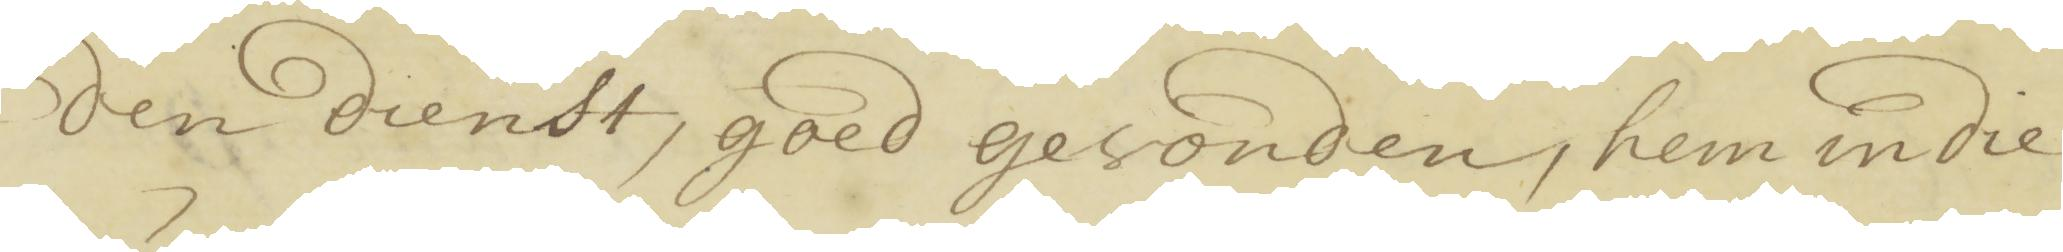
den dienst, goed gevonden, hem in die
